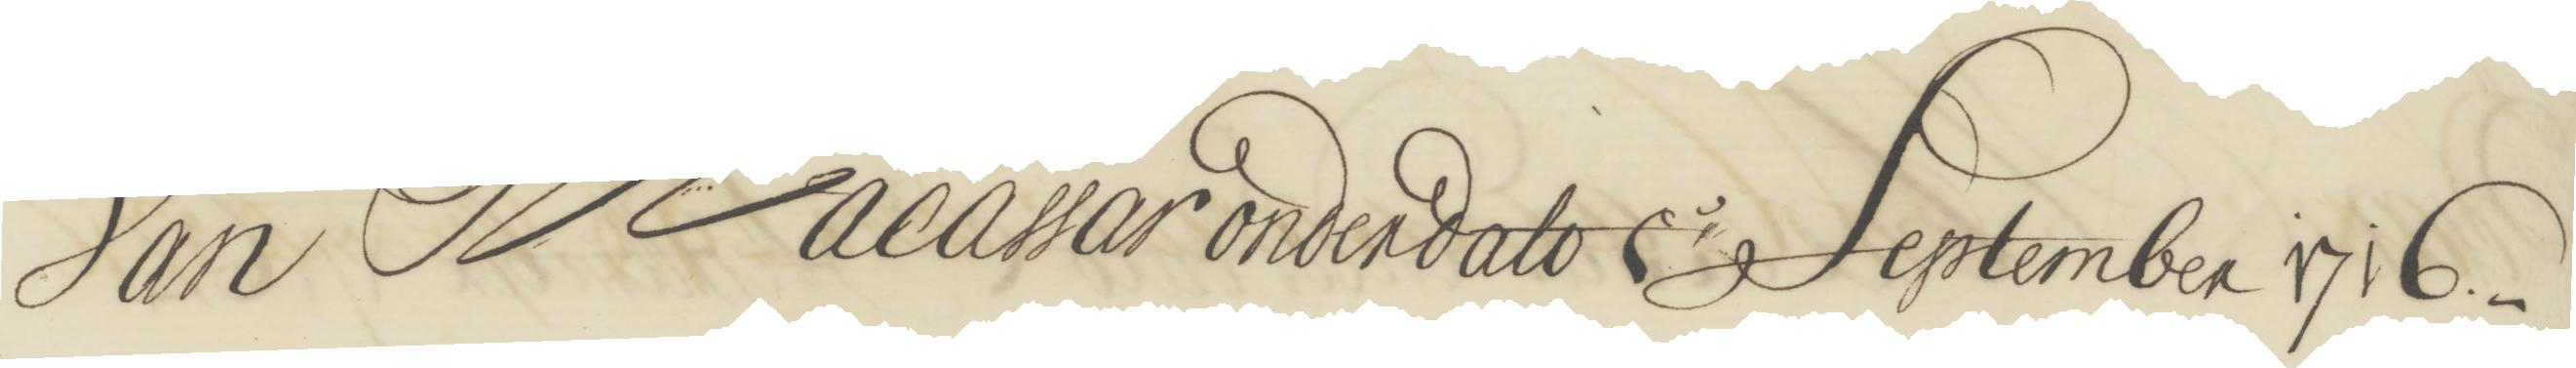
Van Macassar onder dato 5=e September 1716.—
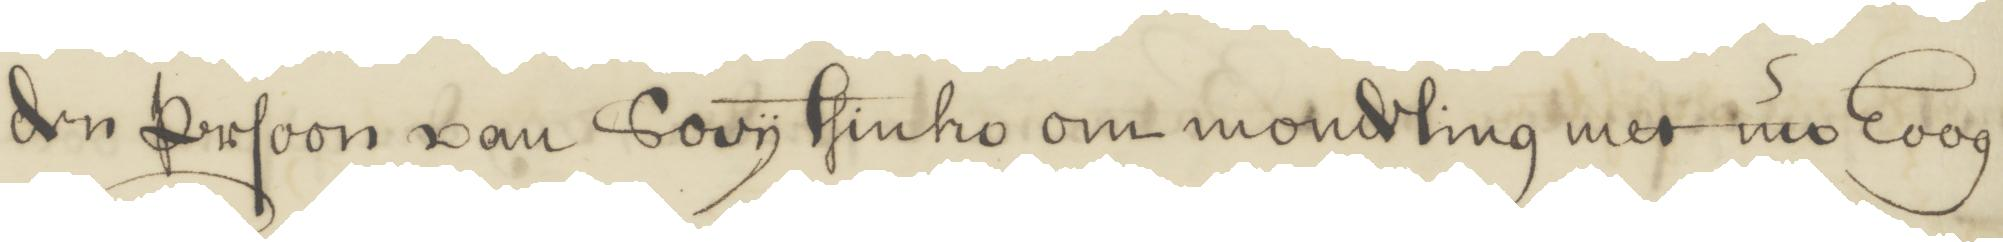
den persoon van Soeij tsinko om mondeling met uw hoog
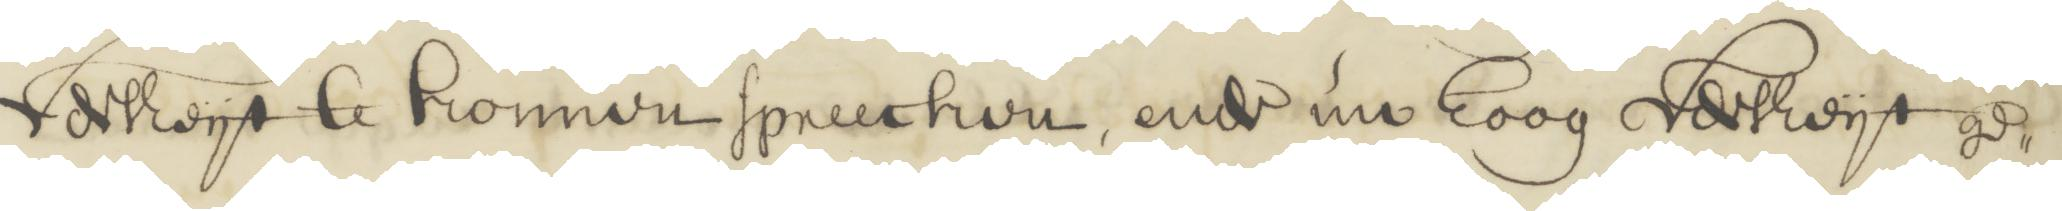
Edelheijt te konnen spreecken, ende uw hoog Edelheijt ge„
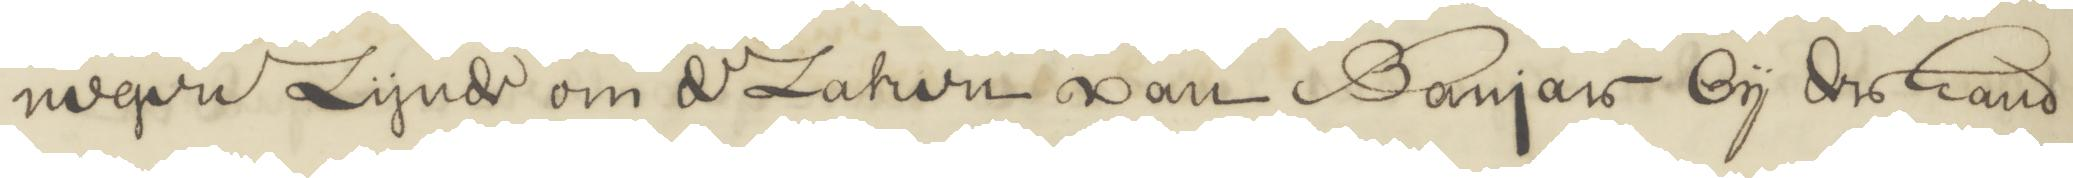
negen Zijnde om de zaken van Banjar bij der hand
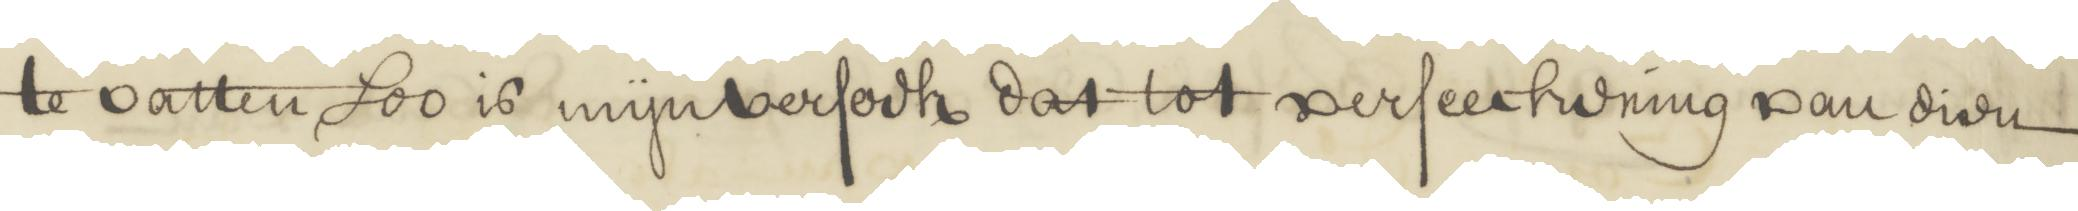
te vatten, Soo is mijn versoek dat tot verseeckening van dien
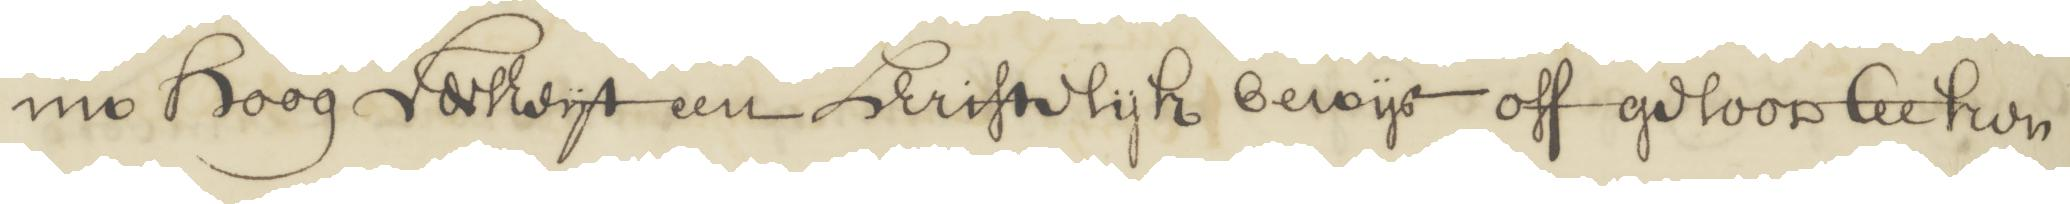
uw Hoog Edelheijt een schriftelijk bewijs off geloovteeken
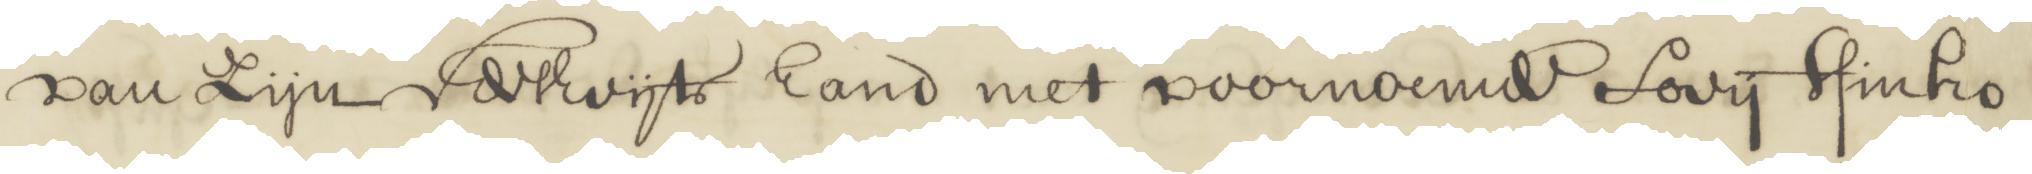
van Zijn Edelheijts hand met voornoemde Soeij tsinko
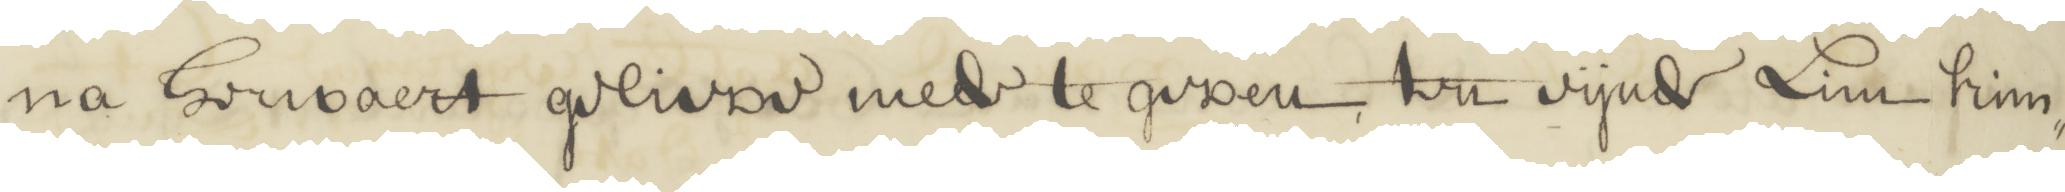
na herwaert gelieve mede te geven, ten eijnde Lim kim„
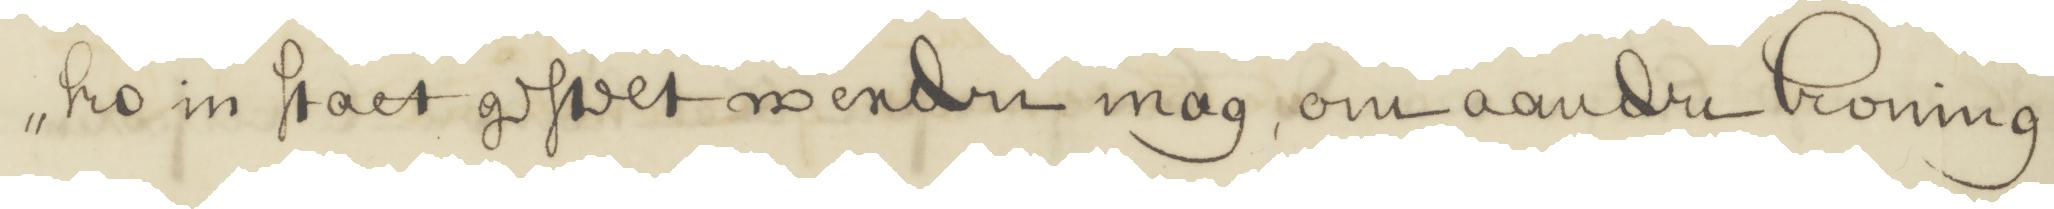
„ko in staet gestelt werden mag, om aan den koning
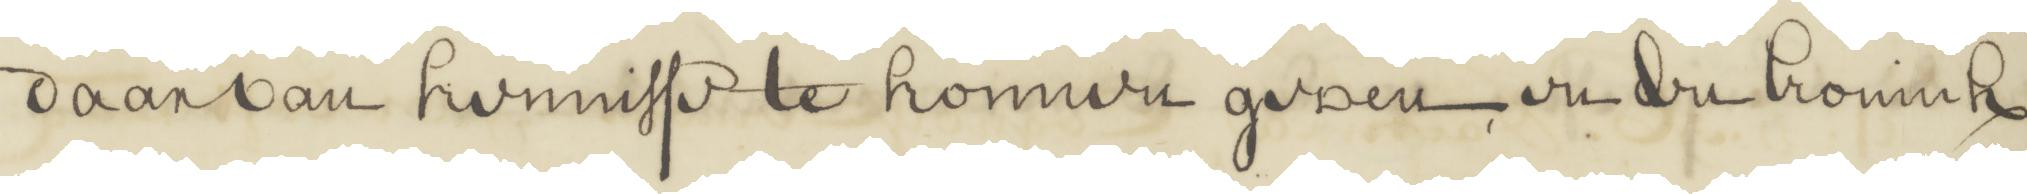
daar van kennisse te konnen geven en den konink
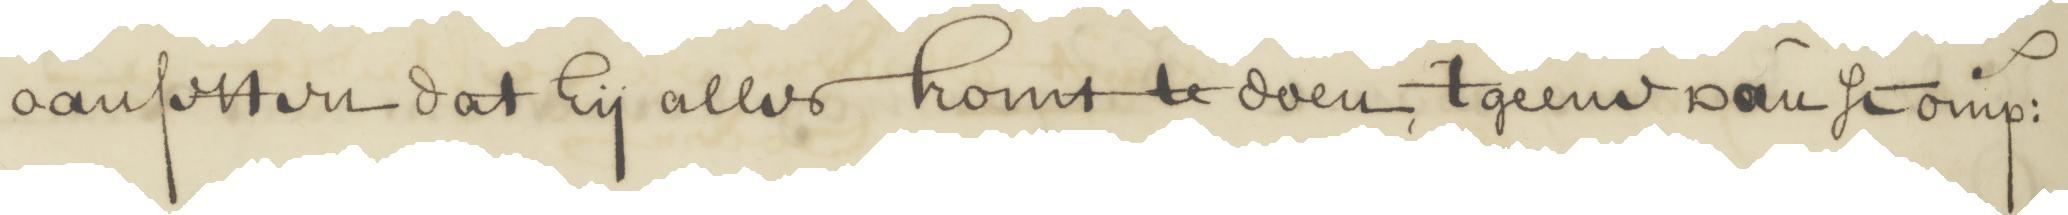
aansetten dat hij alles komt te doen ’t geene van SComp:s
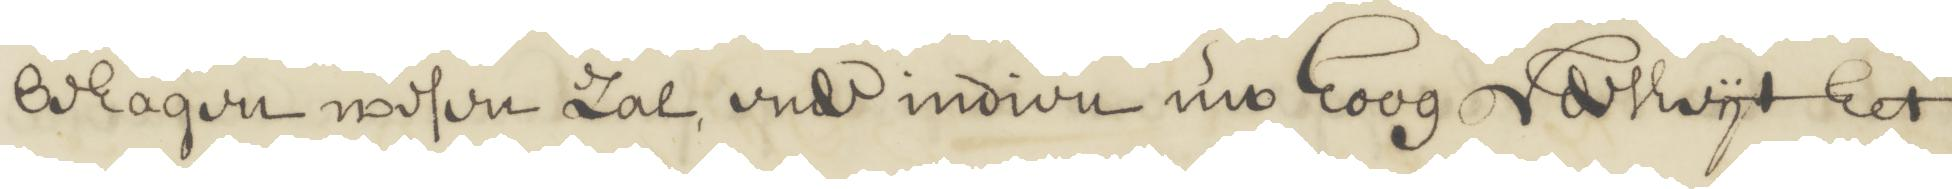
behagen wesen Zal, ende indien uw hoog Edelheijt het
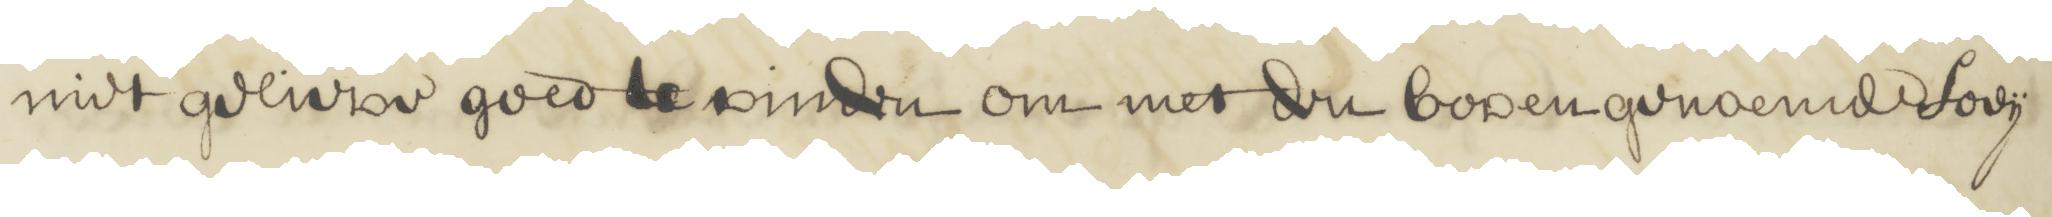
niet gelieve goed te vinden om met den boven genoemde Soeij
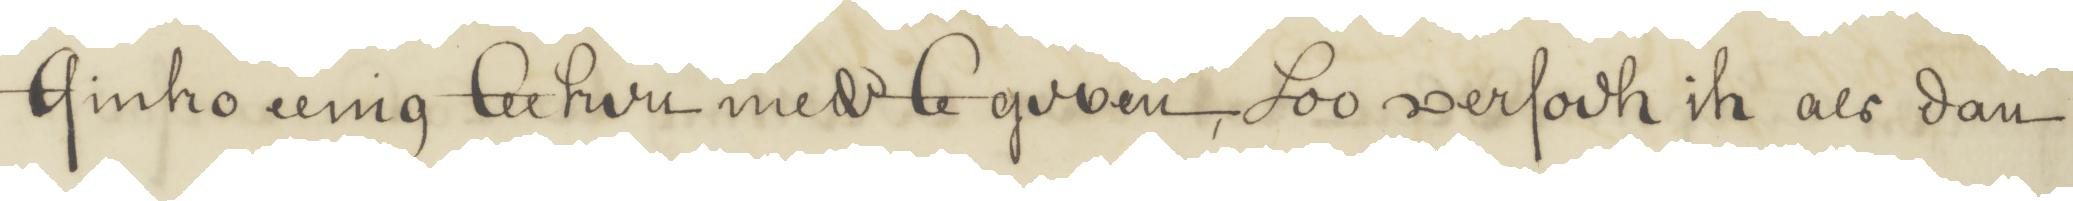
tsinko eenig teeken mede te geven, Soo versoek ik als dan
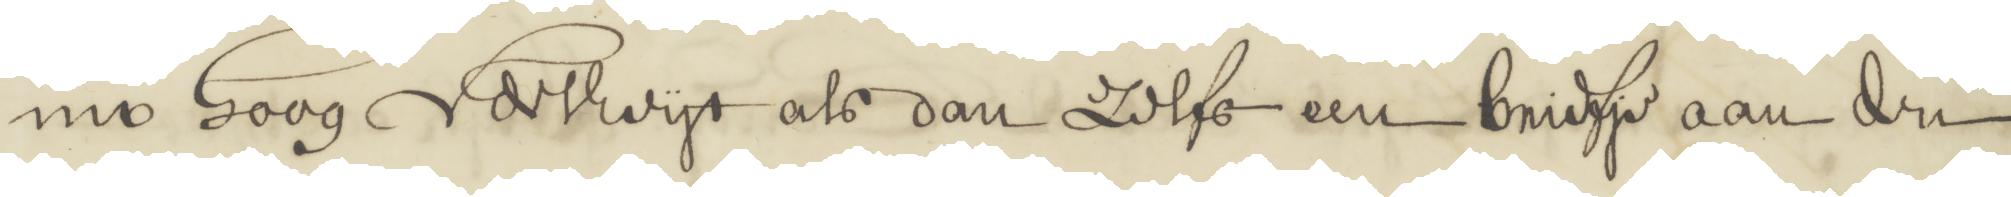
uw hoog Edelheijt als dan Zelfs een briefje aan den
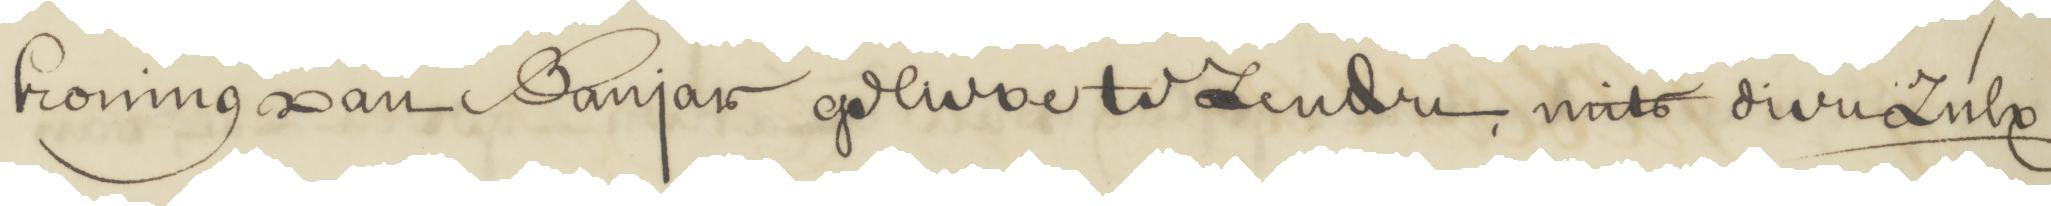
koning van Banjar gelieve te Zenden, mits dien Zulx
